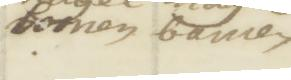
bomen bomen
